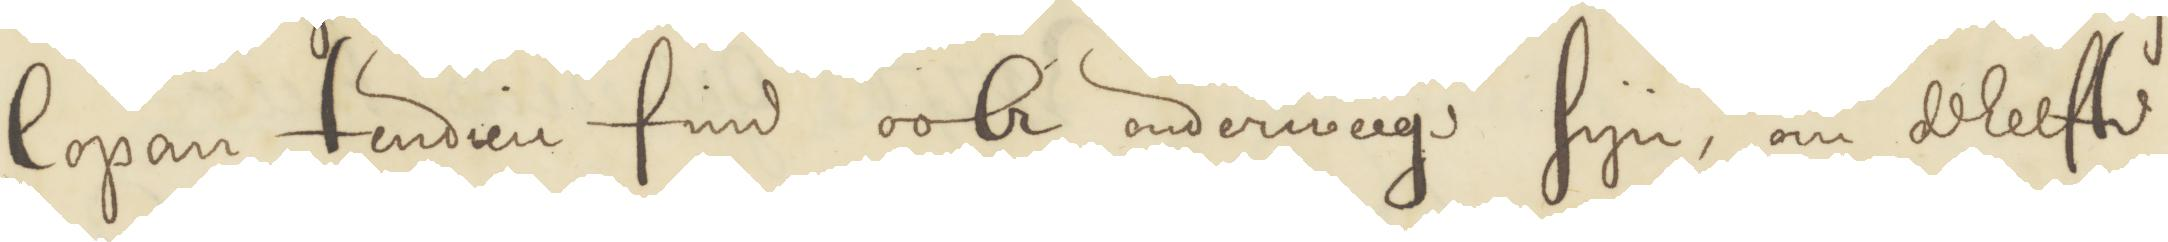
lopan ten dien fine ook onderweege sijn, om de helfte
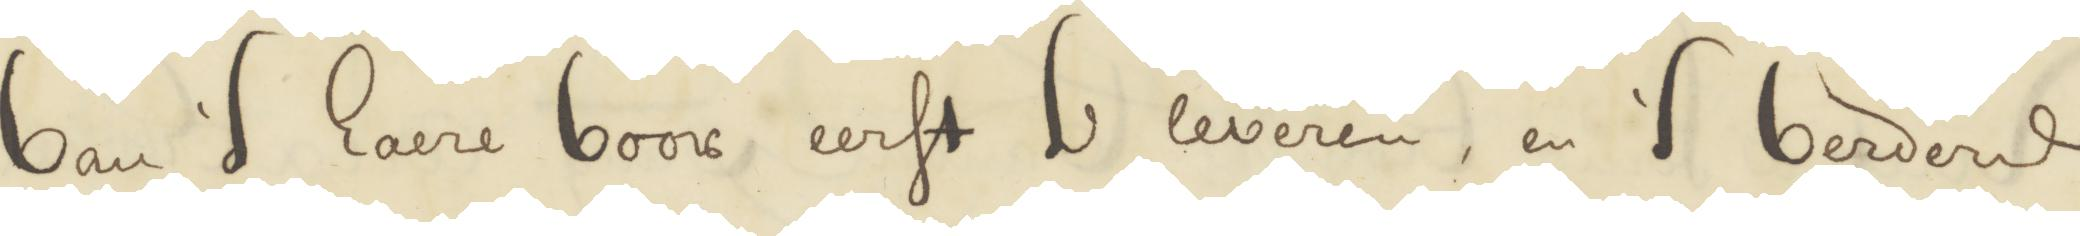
van ’t haere voor eerst te leveren, en ’t verdere
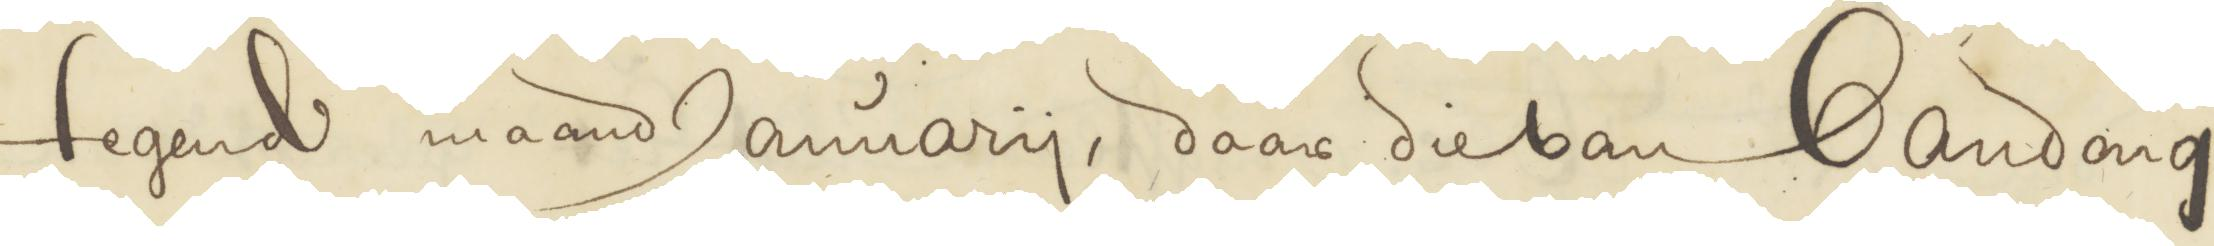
tegen de maand Januarij, daar die van bandong
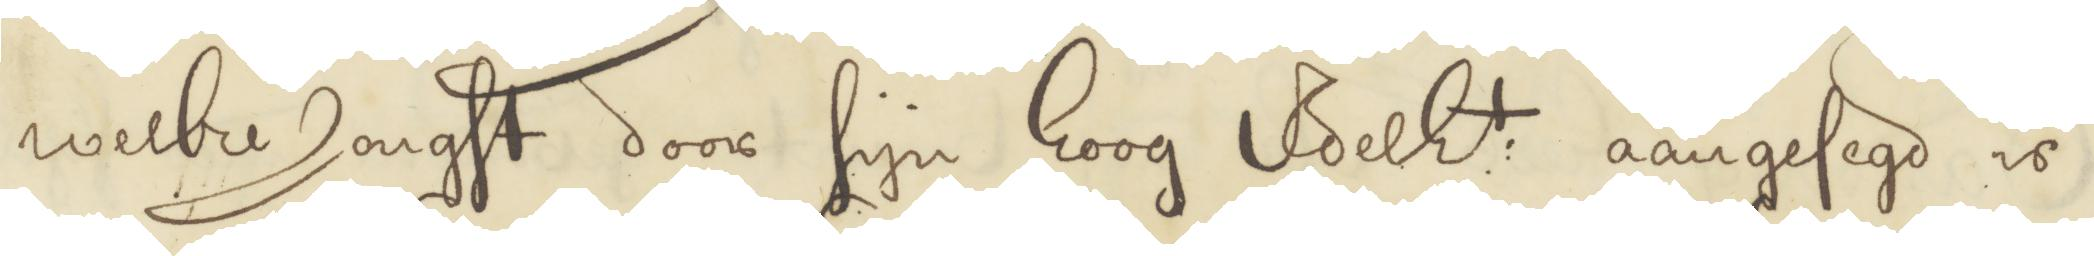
welke Jongst door sijn hoog Edelh:t aangesegd is
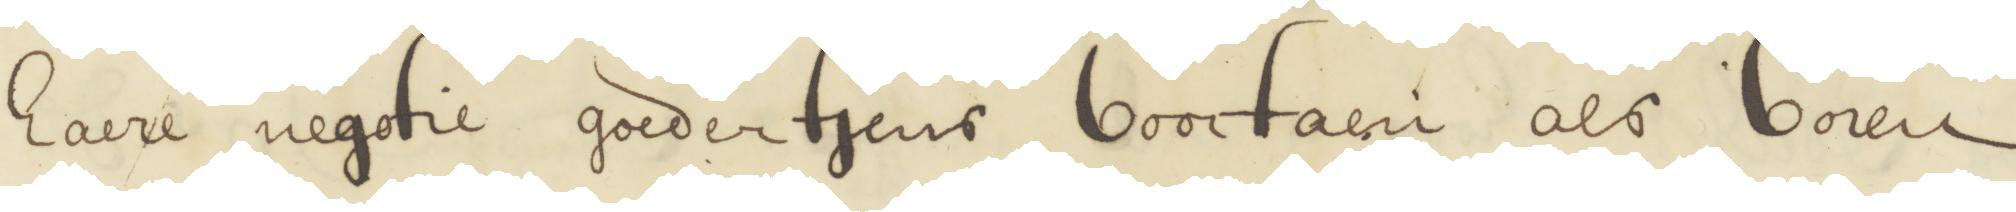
haere negotie goedertjens voortaen als voren
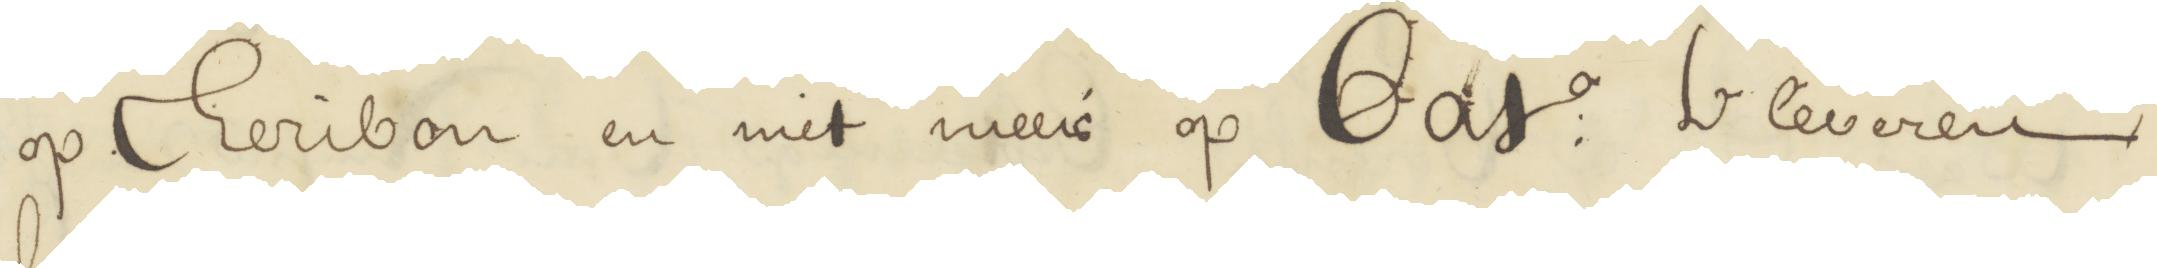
op Cheribon en niet meer op bat:a te leveren
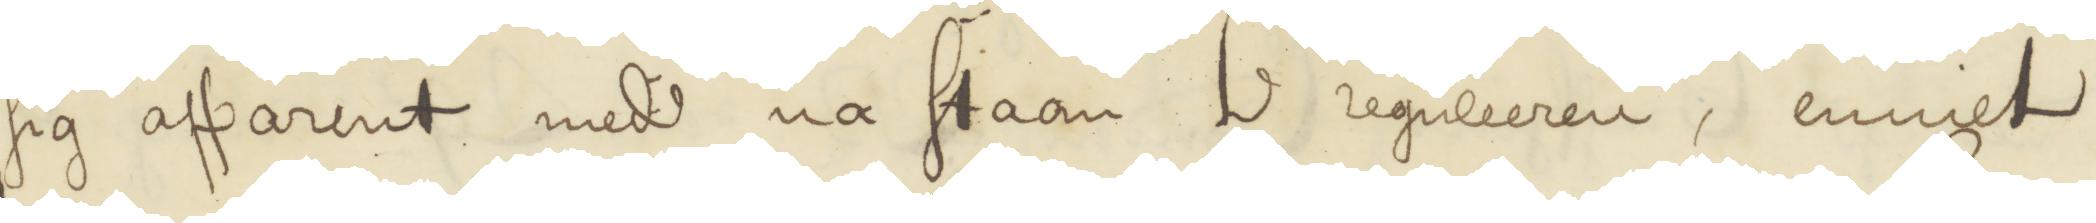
sig apparent mede na staan te reguleeren, en niet
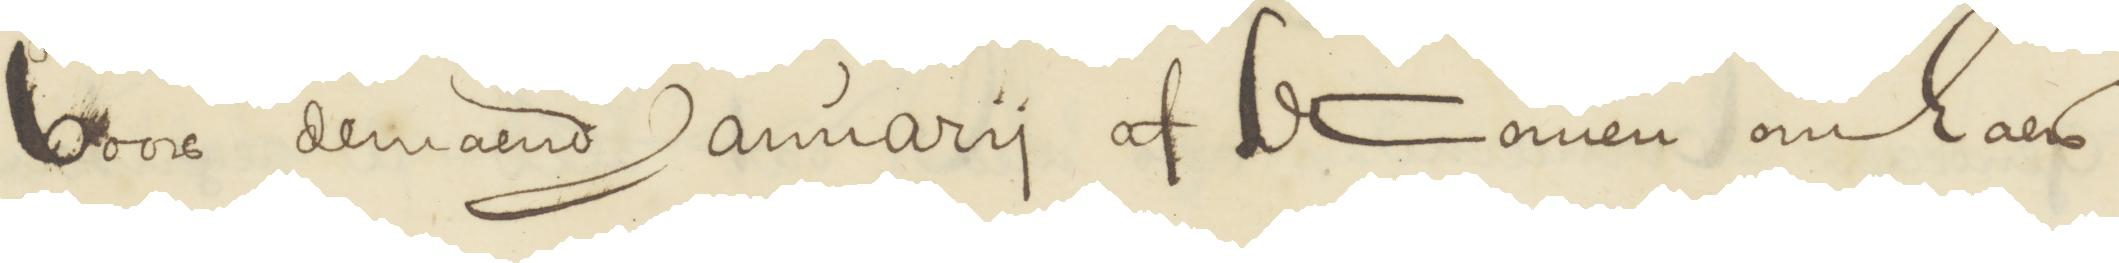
voor de maend Januarij af te comen om haer
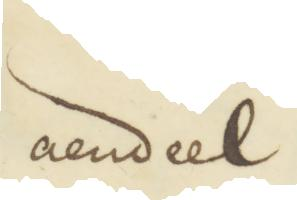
aendeel
